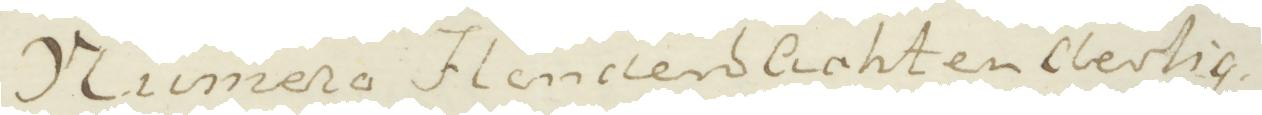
Numero Honderd acht en dertig.
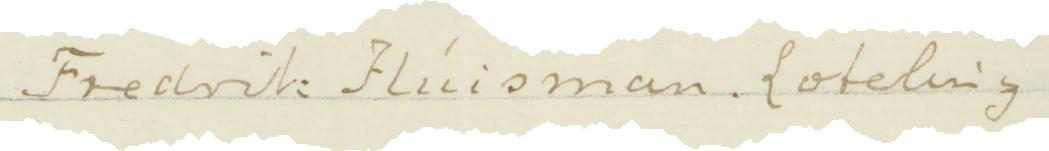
Fredrik Huisman. Loteling
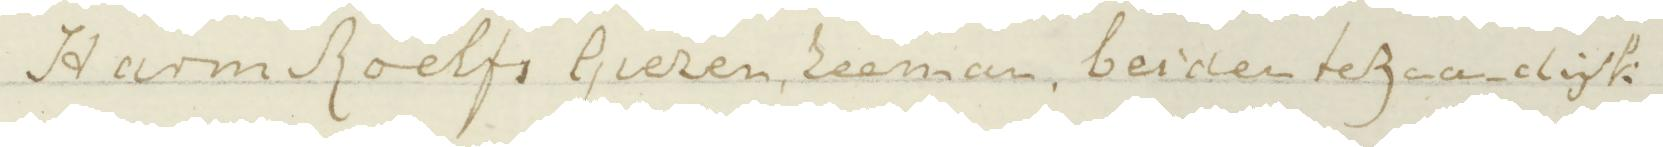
Harm Roelfs Giezen, zeeman, beiden te zaandijk
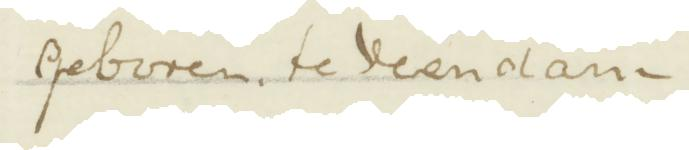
geboren, te Veendam
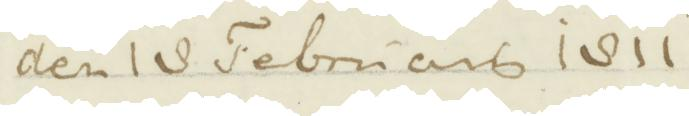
den 18 February 1811
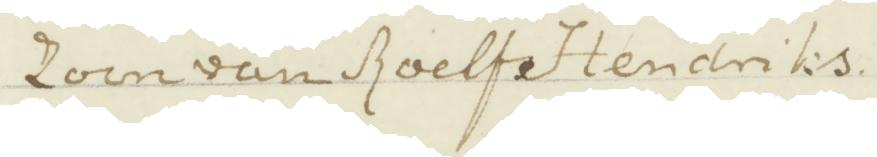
zoon van Roelf Hendriks.
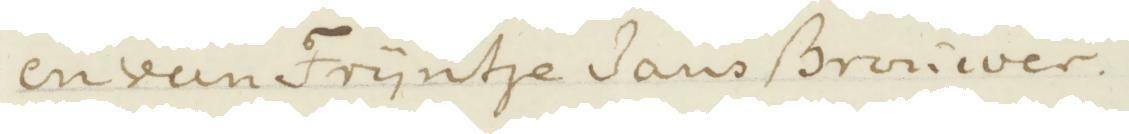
en van Trijntje Jans Brouwer.
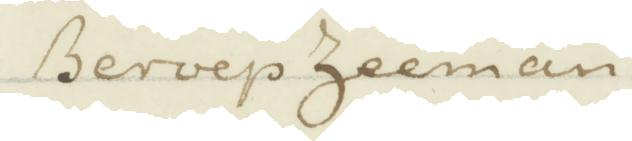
Beroep Zeeman
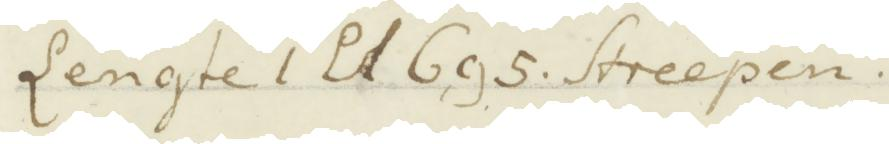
Lengte 1 el 6,95. Streepen.
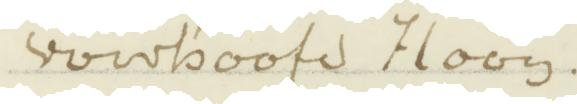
voorhoofd Hoog.
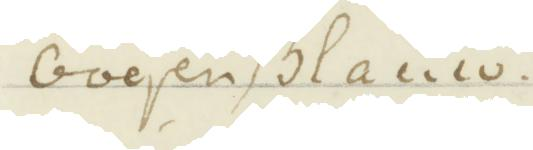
Oogen Blauw.
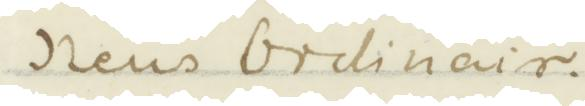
Neus Ordinair.
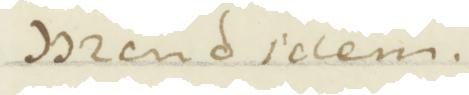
mond idem.
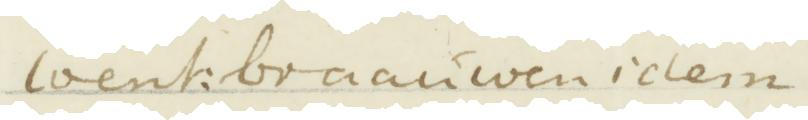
wenkbraauwen idem
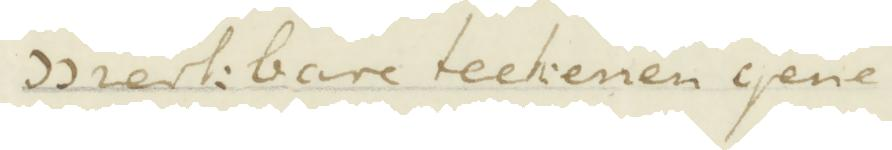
merkbare teekenen gene
